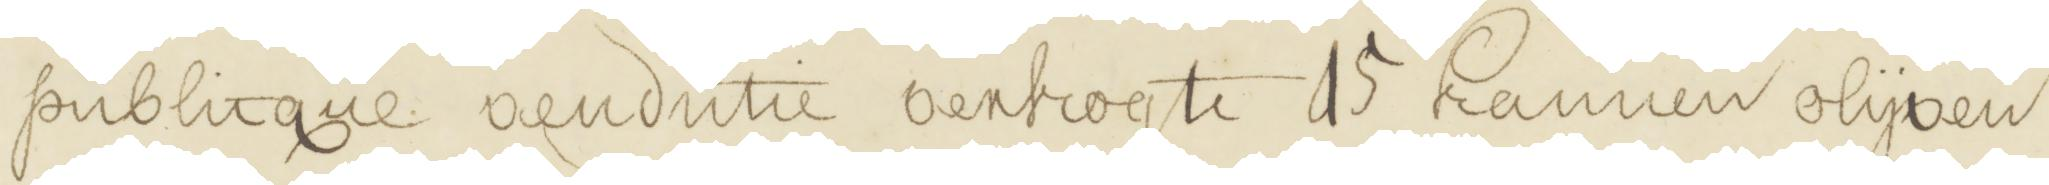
publicque vendutie verkogte 45 kannen olijven
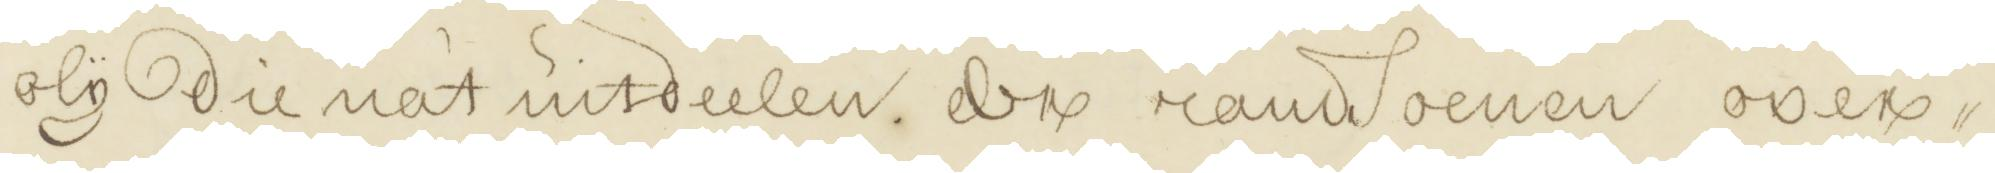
olij die na't uitdeelen. der randsoenen over„
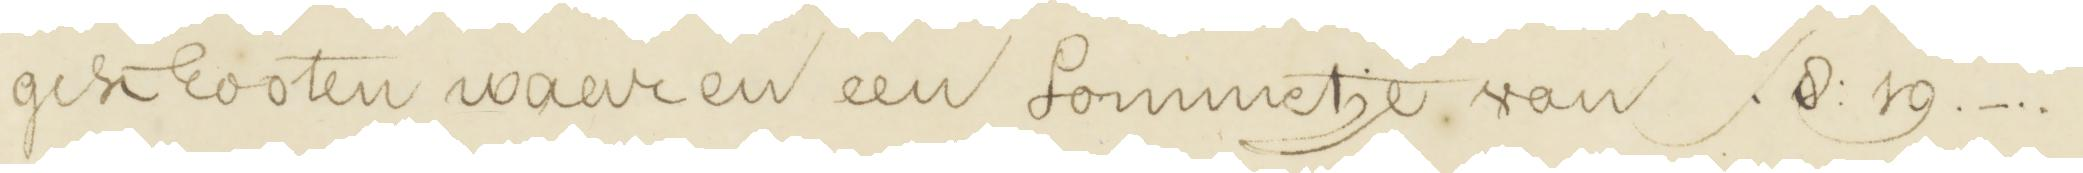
geschooten waar en een sommetje van ƒ 8: 19.—..
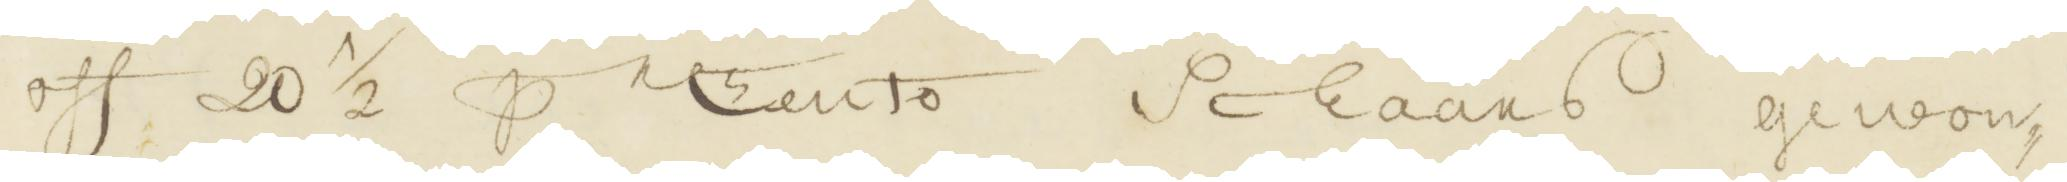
off 20½ prCento schaars gewon„
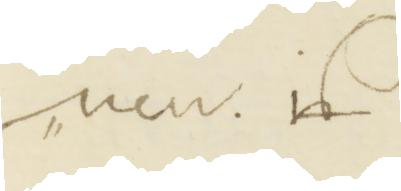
„nen. is
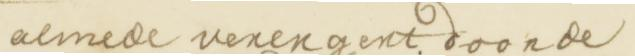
almede verergert door de
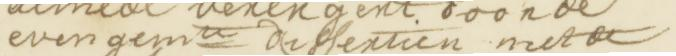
even gem=te dissertien met de
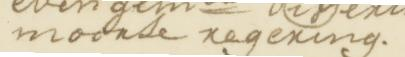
moorse regering.
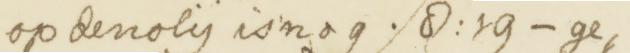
op denolij is nog ƒ8:19- ge„
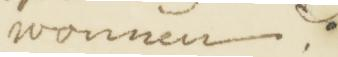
wonnen.
